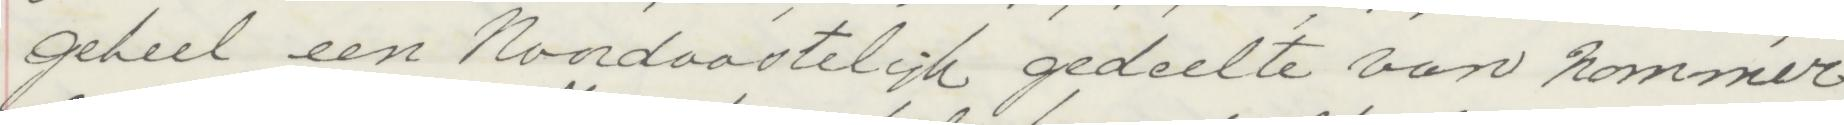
geheel, een Noordoostelijk gedeelte van nommer
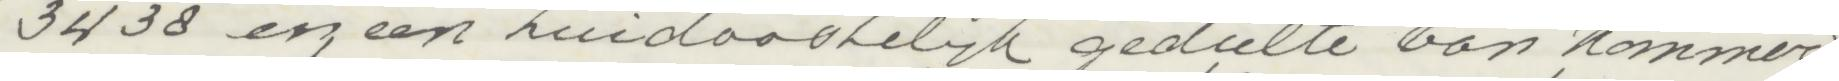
3438 en een Zuidoostelyk gedeelte van nommer
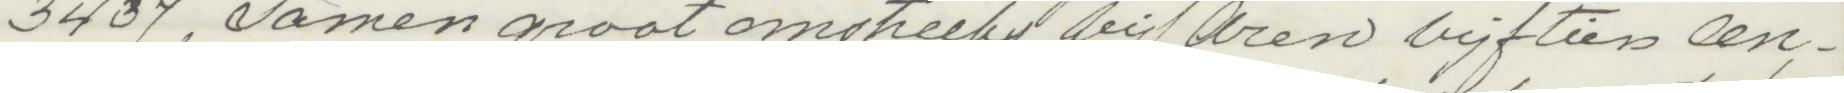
3437, samen groot omstreeks vijf Aren vijftien cen-
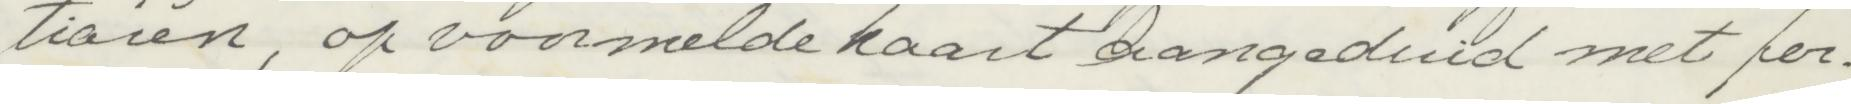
tiaren, op voormelde kaart aangeduid met per-
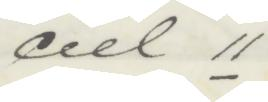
ceel 11
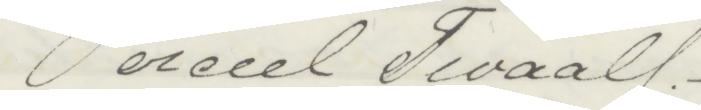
Perceel Twaalf.
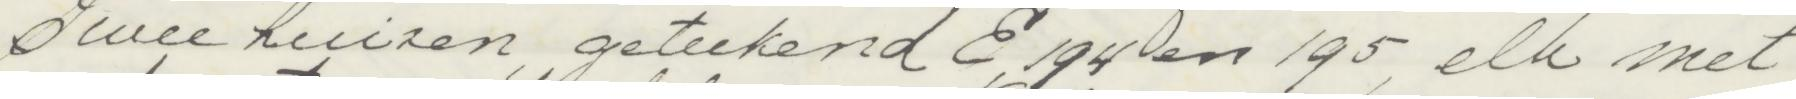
Twee huizen, geteekend E 194 en 195, elk met
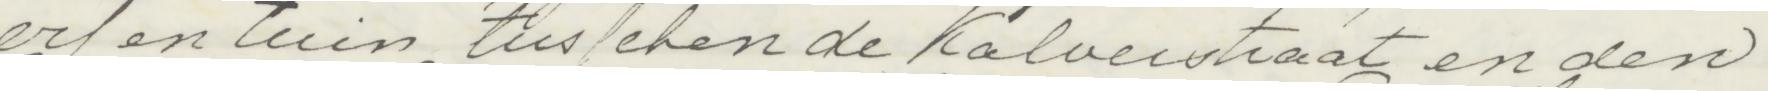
erf en tuin, tusschen de Kalverstraat en den
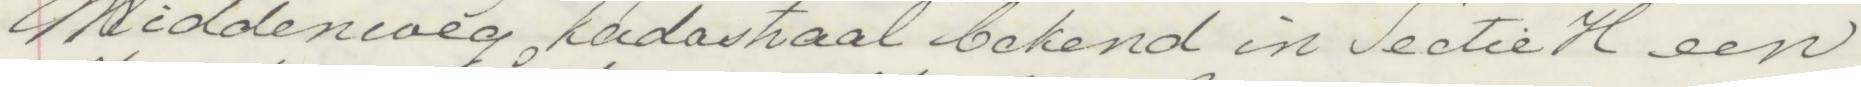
Middenweg, kadastraal bekend in sectie H een
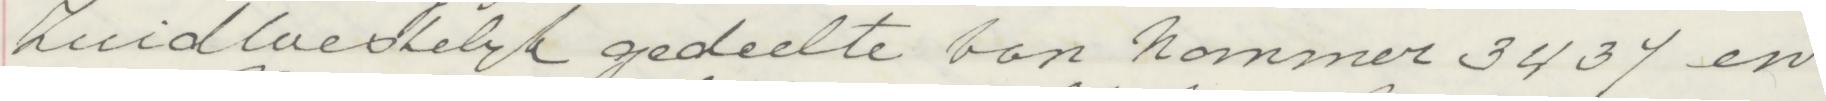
Zuidwestelyk gedeelte van nommer 3437 en
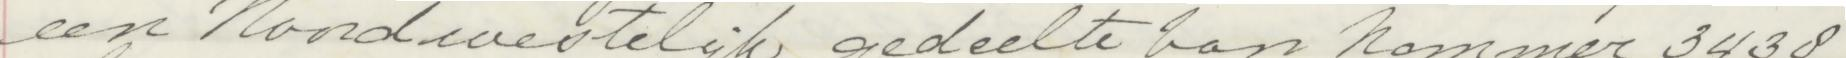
een Noordwestelijk gedeelte van nommer 3438,
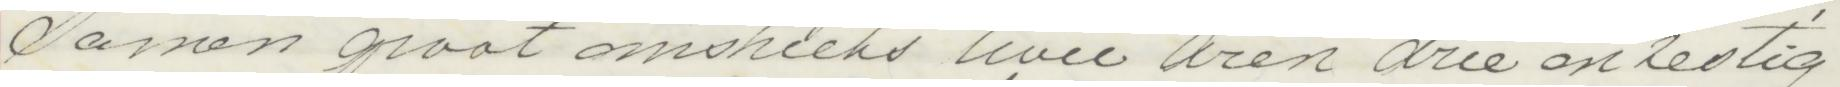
samen groot omstreeks twee Aren drie en zestig
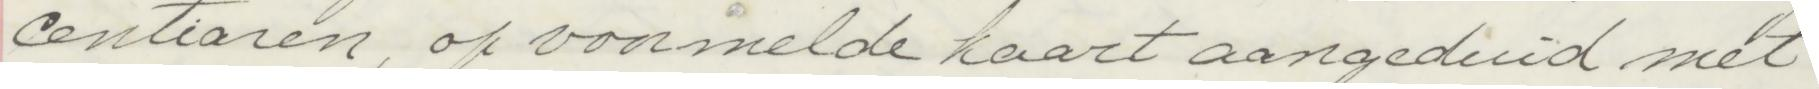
centiaren, op voormelde kaart aangeduid met
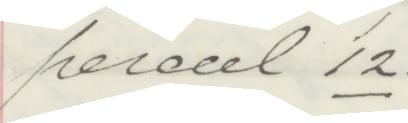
perceel 12
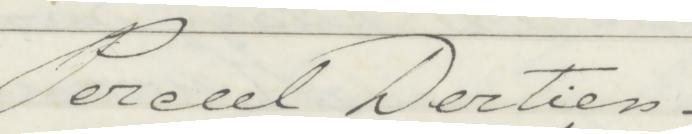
Perceel Dertien
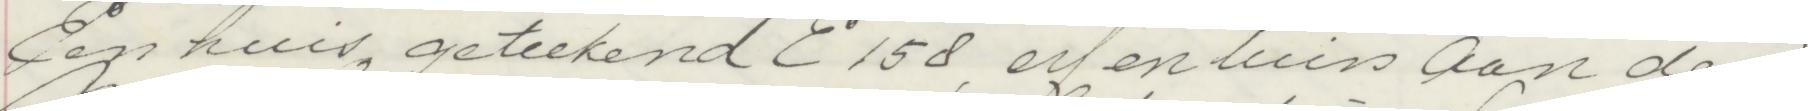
Een huis, geteekend E 158, erf en tuin Aan den
